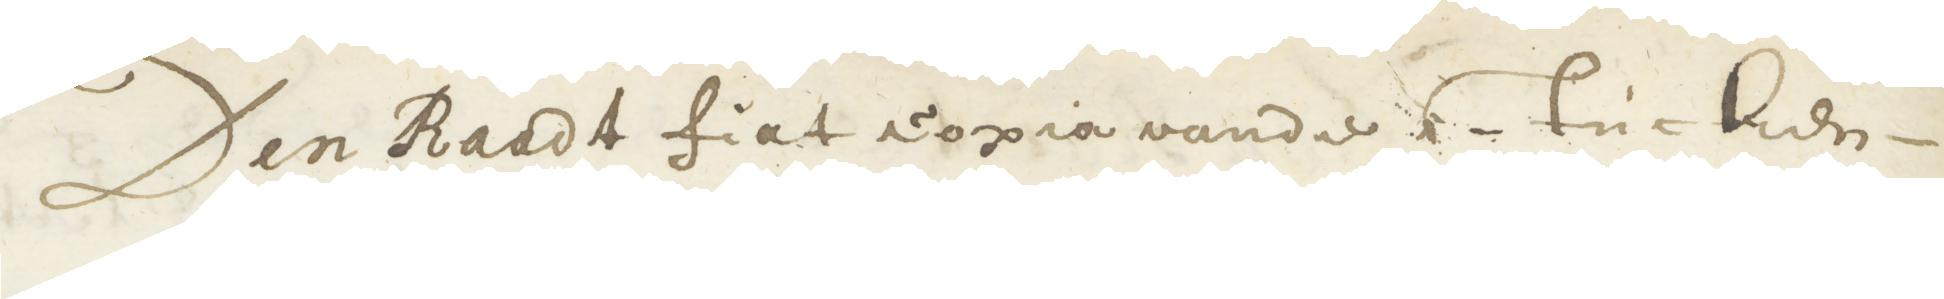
Den Raadt fiat Copia vande stucken —
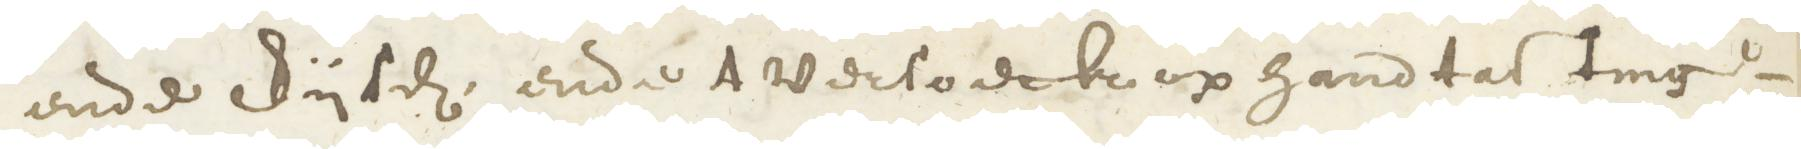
ende Eijsch ende 't versoeck op handtastinge —
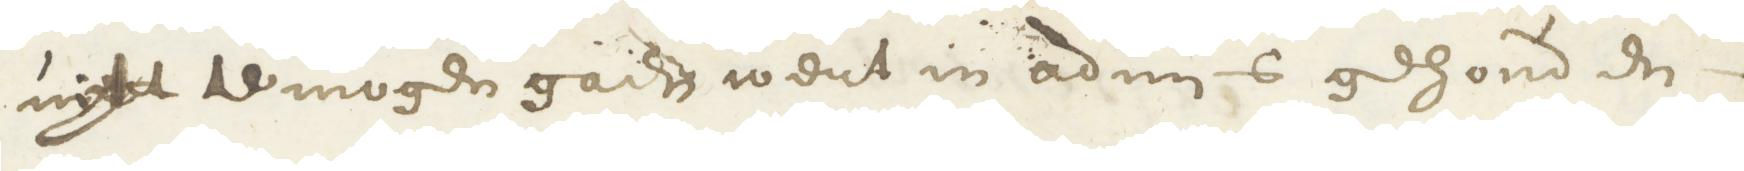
uijt te mogen gaen wert in advijs gehouden
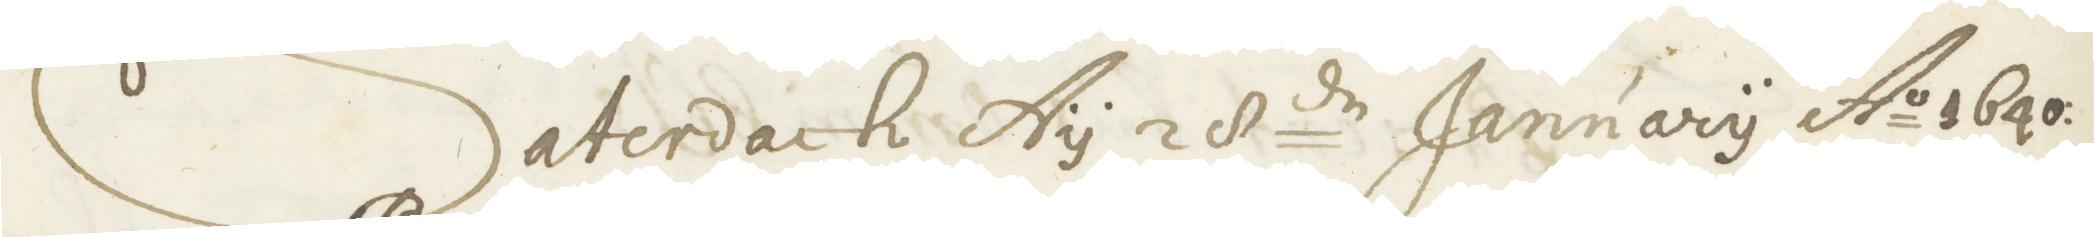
Saterdach Aij 28=en Januarij A=o 1640:
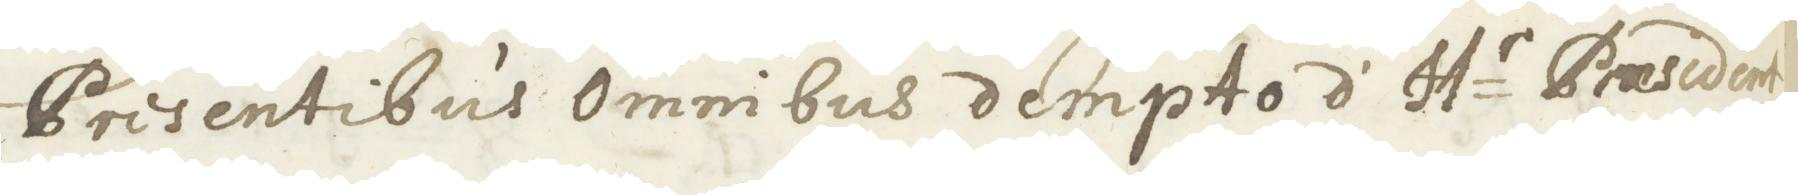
Presentibus ommbus d empto d’ H=r Praesident
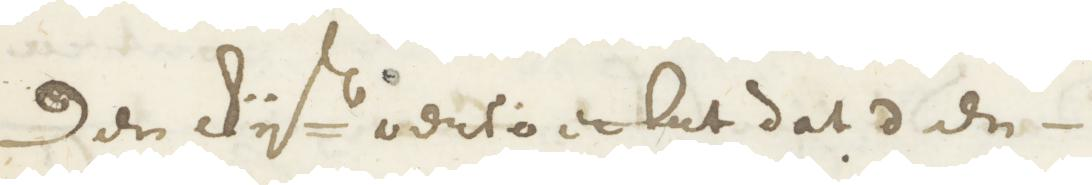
Den Eij=r versoeckt dat den —
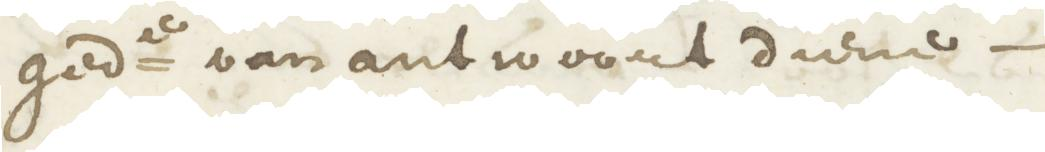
ged=e van antwoort diene —
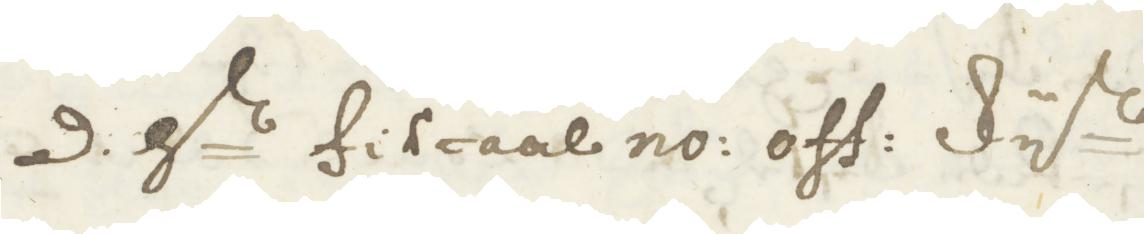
D. h=r fiscaal no: off: Eij=r
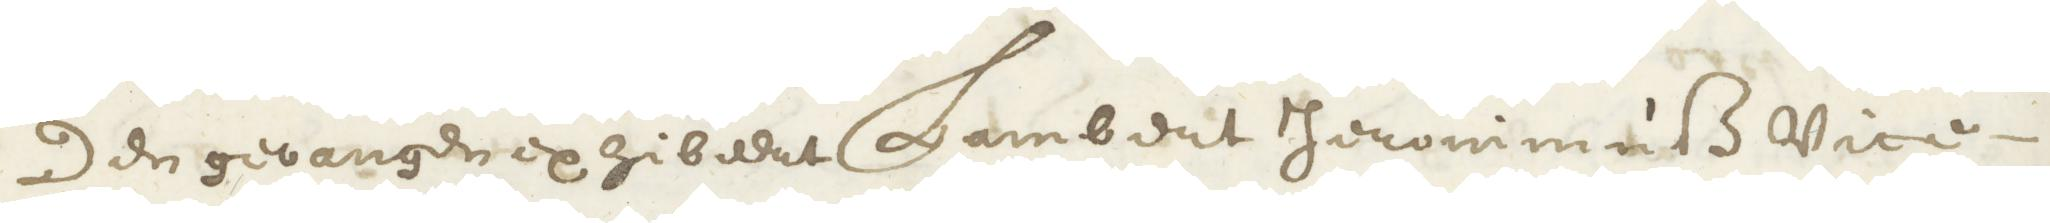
Den gevangen exhibeert Lambert Jeronimuꞵ Vice —
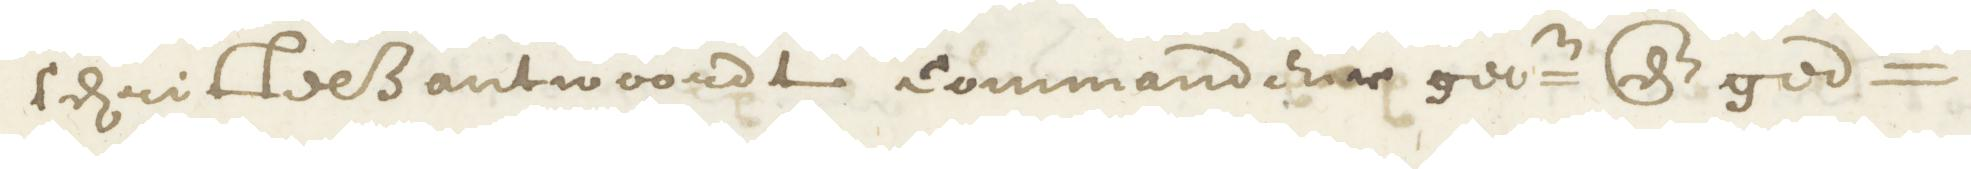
schriftelijk antwoordt Commandeur gev=n ende ged=e
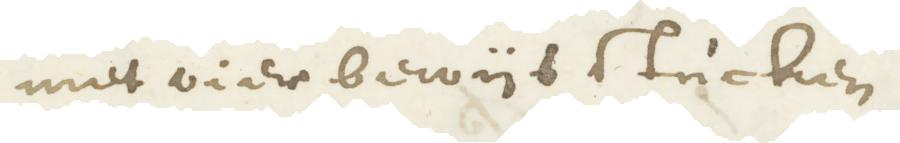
met vier bewijs stucken
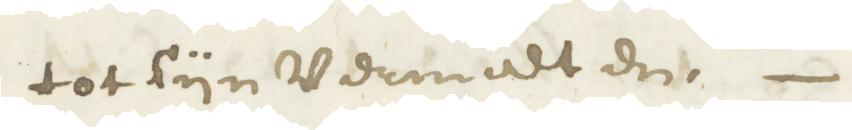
tot sijn vermeeten. —
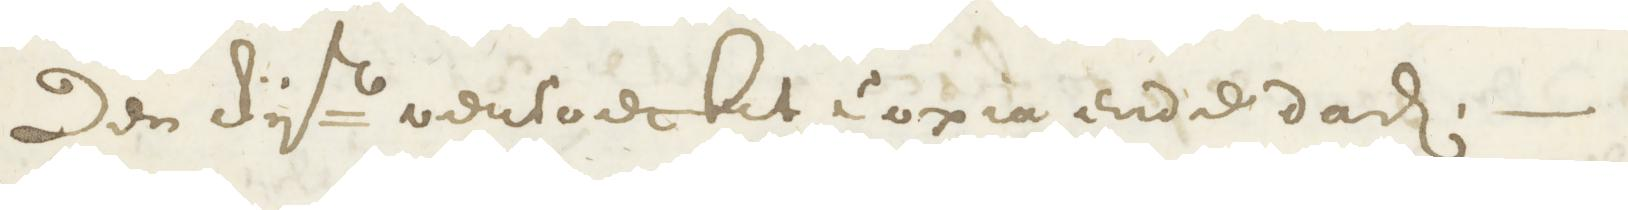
Den Eij=r versoeckt Copia ende dach. —
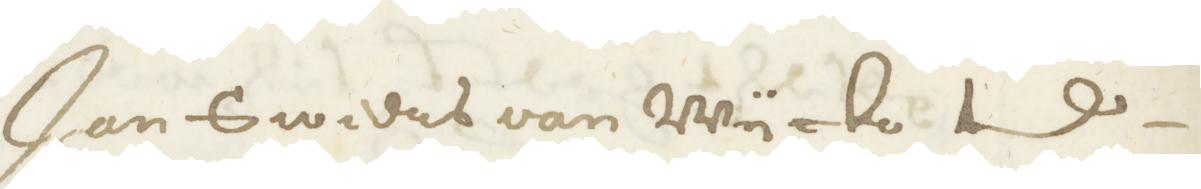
Jan Sweers van Wijck te —
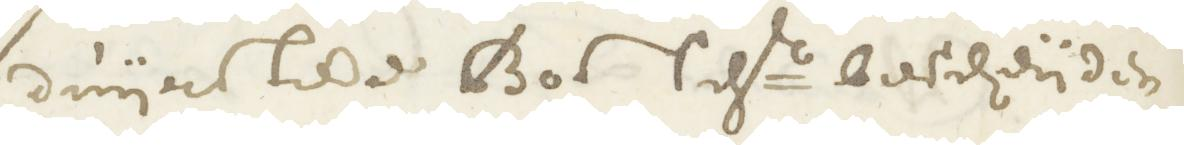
duijrstede Bossch=r bescheijden
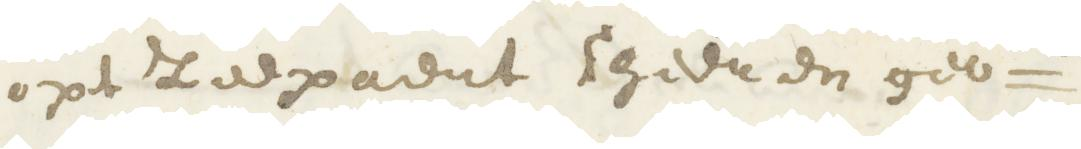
op t Zeepaert s heeren gev=n
